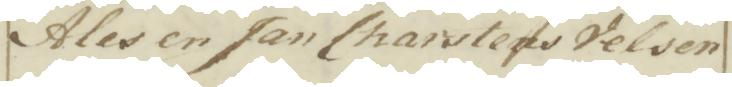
Ales en Jan Charstens Velsen
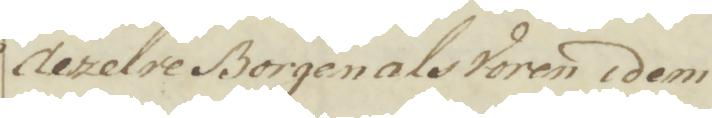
dezelve Borgen als Voren idem
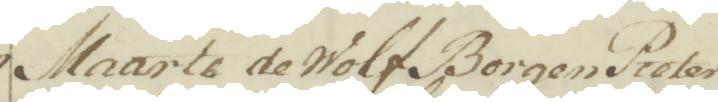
Maarte de wolf Borgen Piete
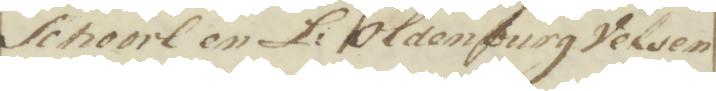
Schoorl en L: Oldenburg Velsen
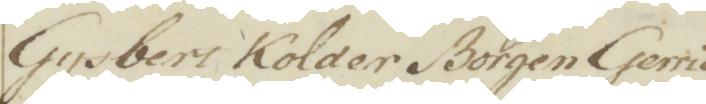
Gysbert Kolder Borgen Gerri
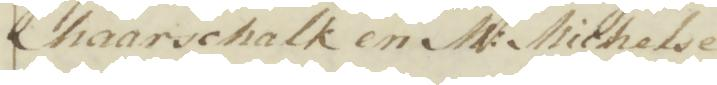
Maarschalk en M: Michels
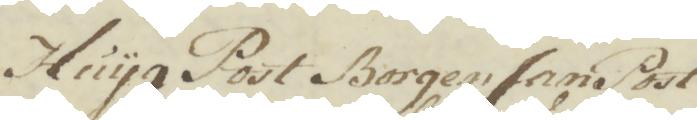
Huijg Post Borgen Jan Post
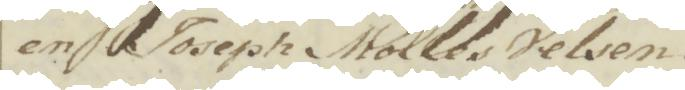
en Joseph Molles Velsen
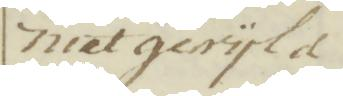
niet gevijld
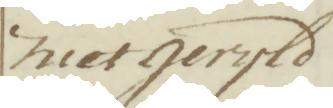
niet gevyld
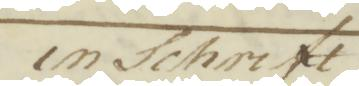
in Schrift
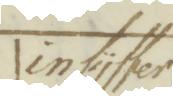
in Cijffer
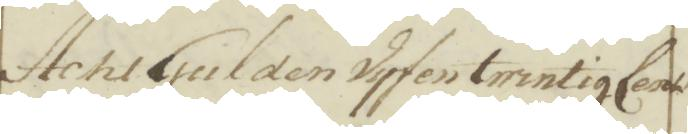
Acht Gulden Vyf en twintig Cen
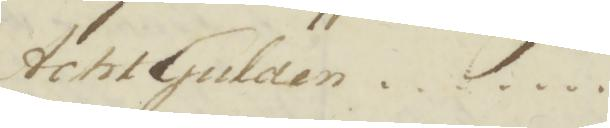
Acht Gulden . . . . . .
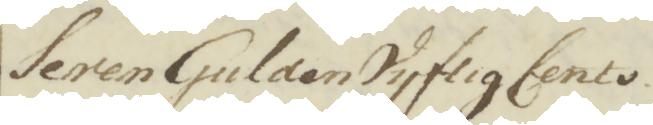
Seven Gulden Vyftig Cents.
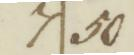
7 50
